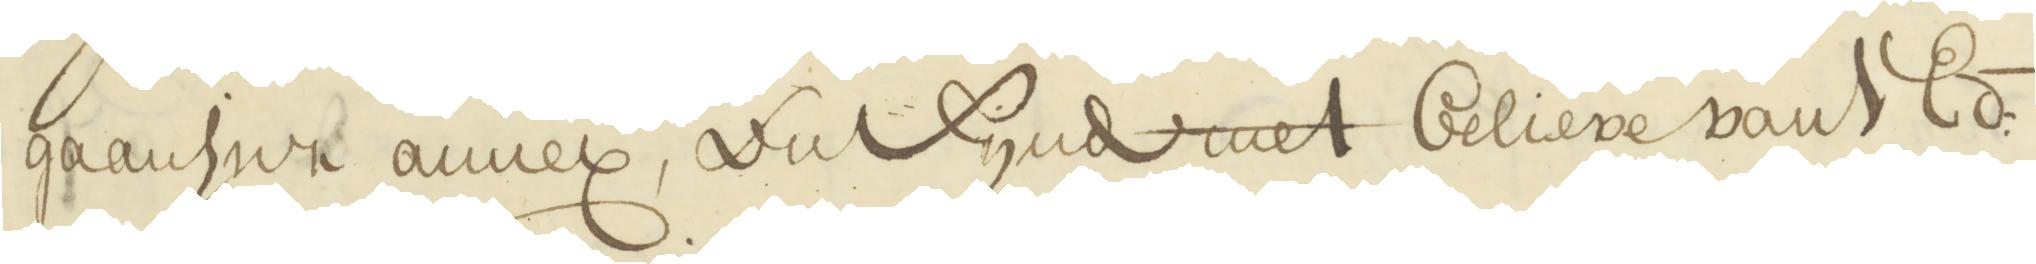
gaanhier annex, ten Eijnde met believe van V Ed:
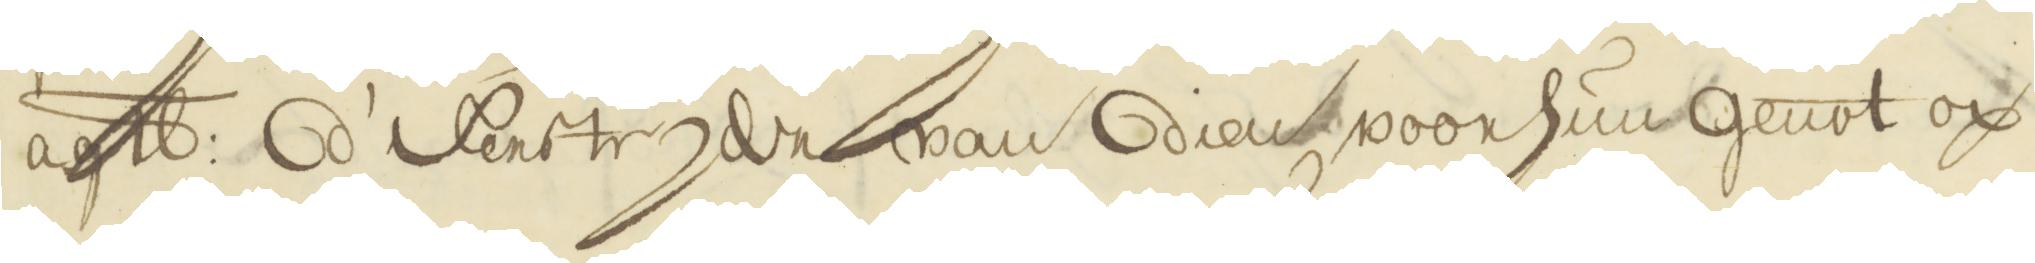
agtb: d’ Eerste jder van dien voor hun genot op
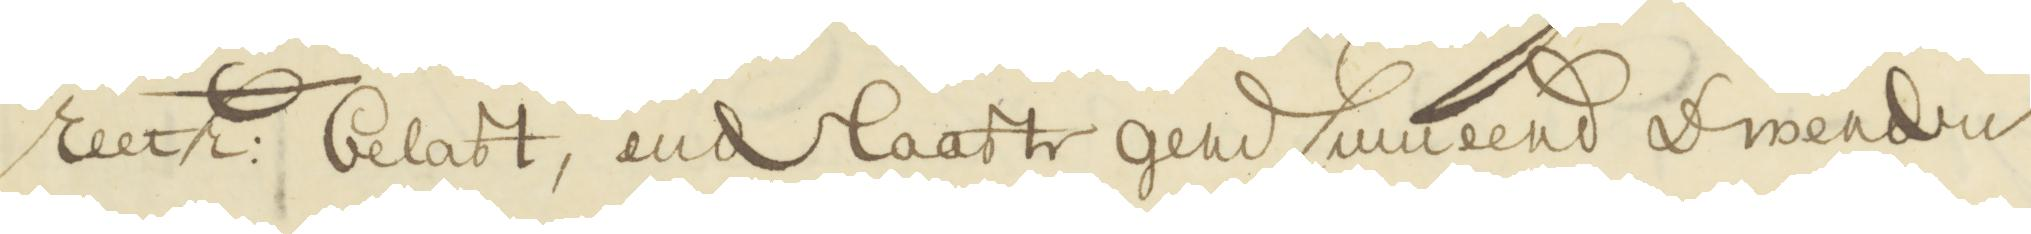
reeck: belast, ende laaste geresumeerd te werden
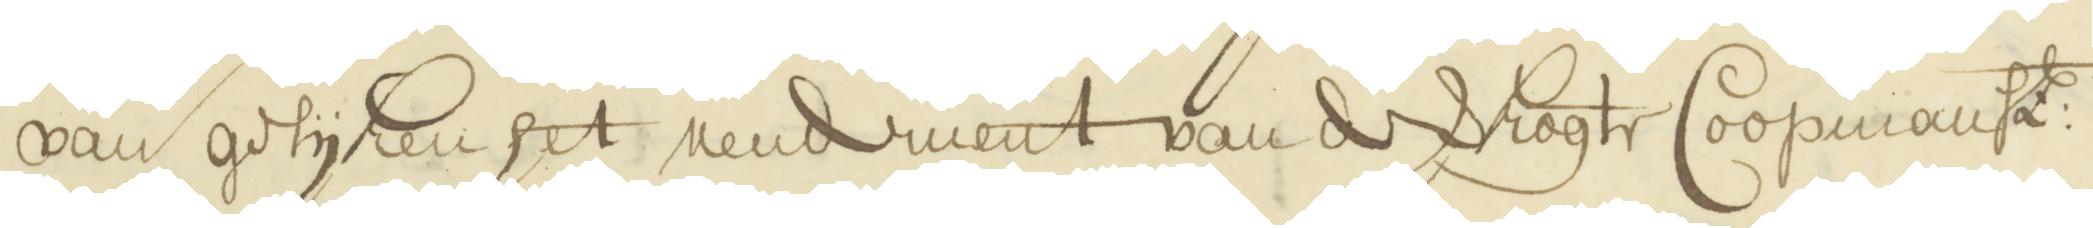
van gelijken het rendement van de verkogte Coopmansz:
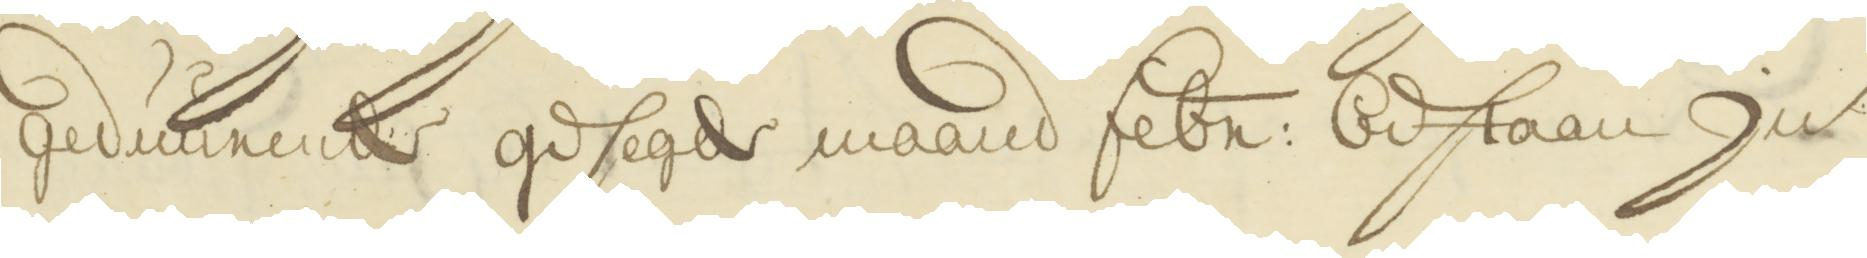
geduurende gesegde maand febr: bestaan jn
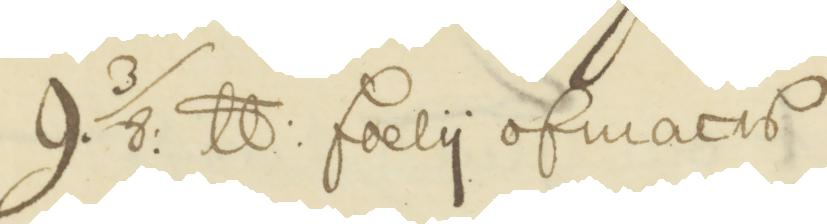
9.3/8: lb: foelij ofmacis
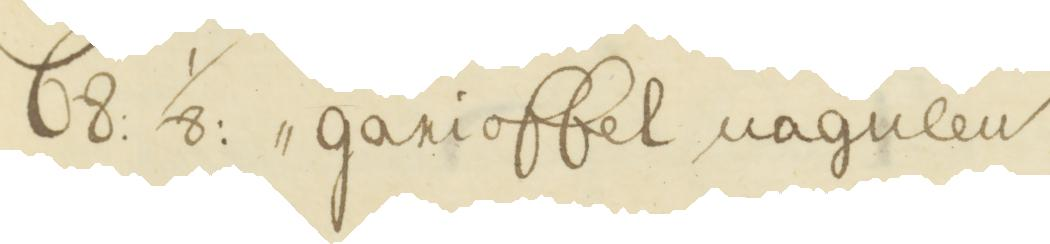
68: 1/8: „ garioffel nagulen
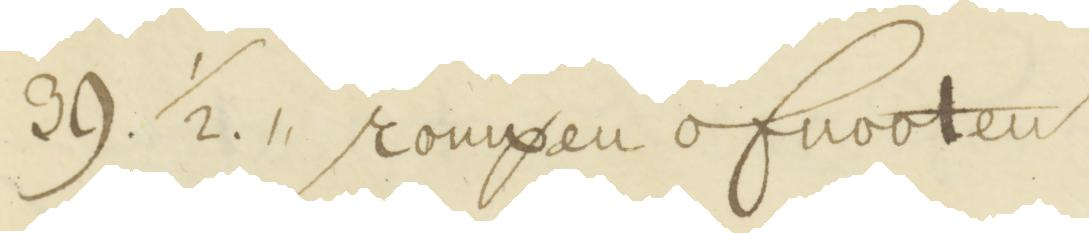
39. ½. „ rompen ofnooten
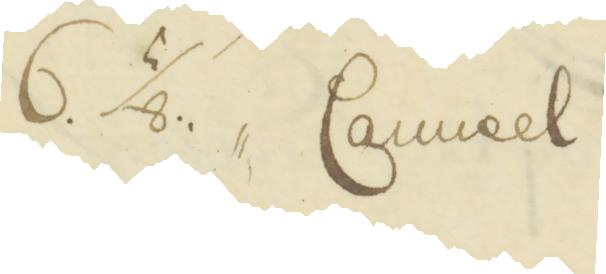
6. 5/8: „ Canneel
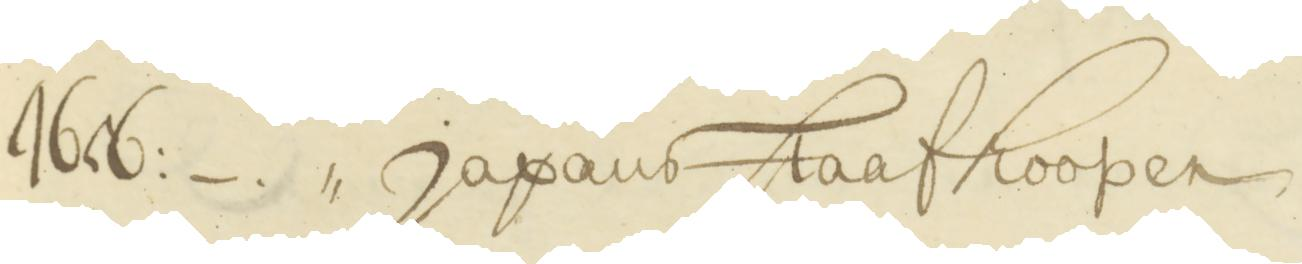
4656:—. „ japans staafkooper
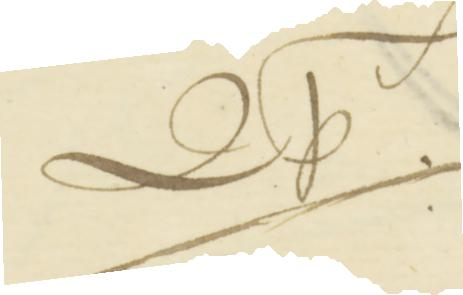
2 ps./.
